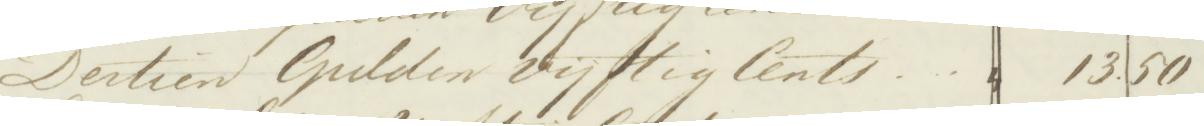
Dertien Gulden vijftig Cents . . . „ 13.50
